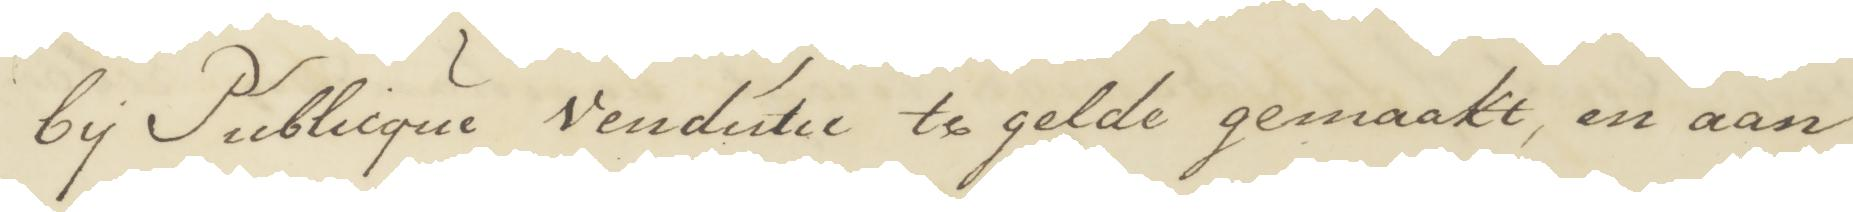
bij Publicque vendutie te gelde gemaakt, en aan
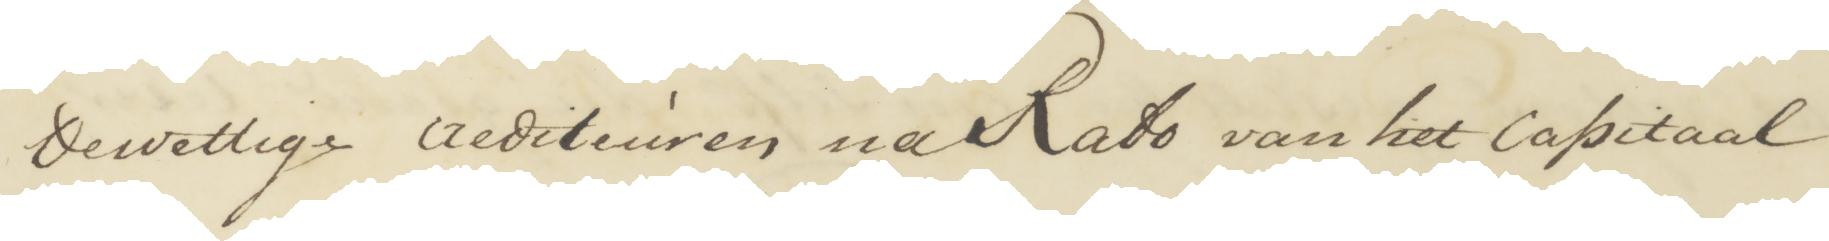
dewettige crediteuren na Rato van het capitaal
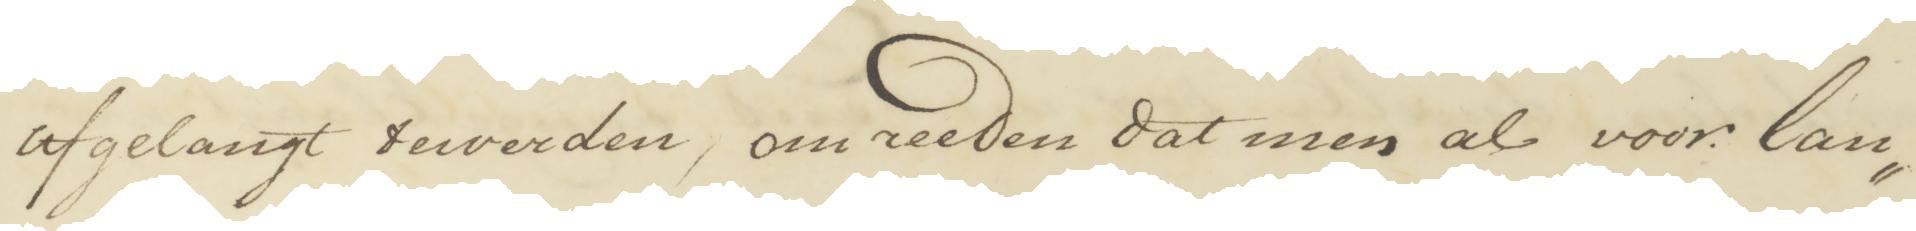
afgelangt tewerden, om reeden dat men al voor lan„
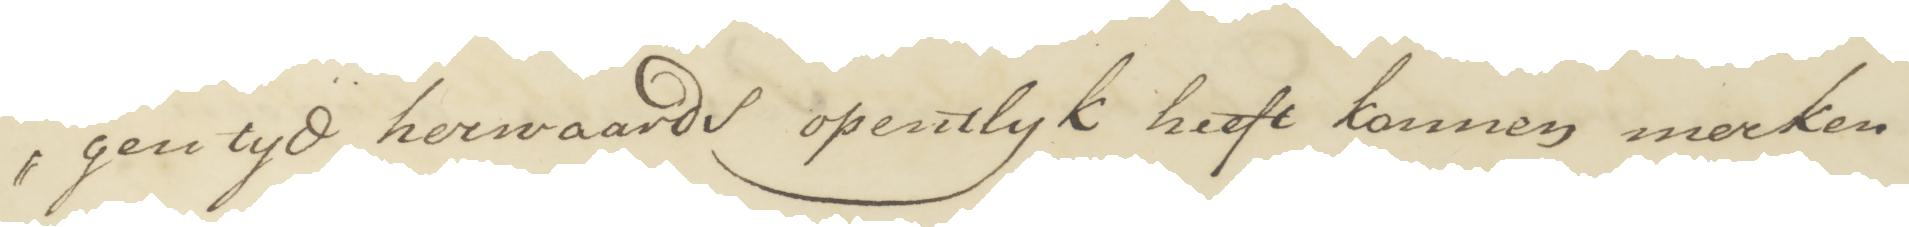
„gen tijd herwaards opentlyk heeft konnen merken
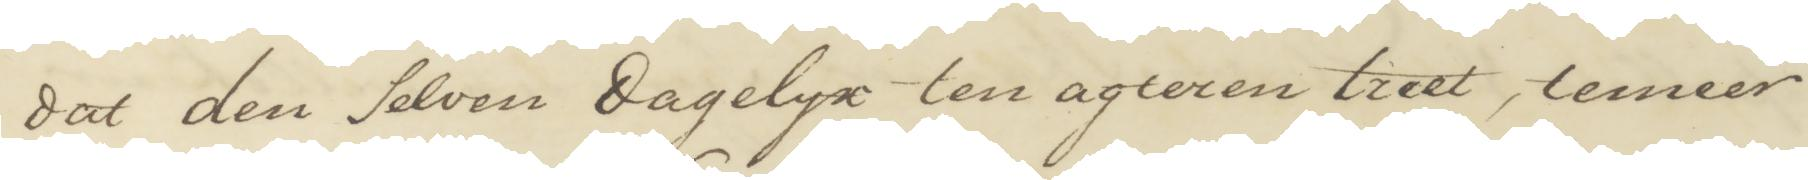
dat den selven dagelyx ten agteren treet, temeer
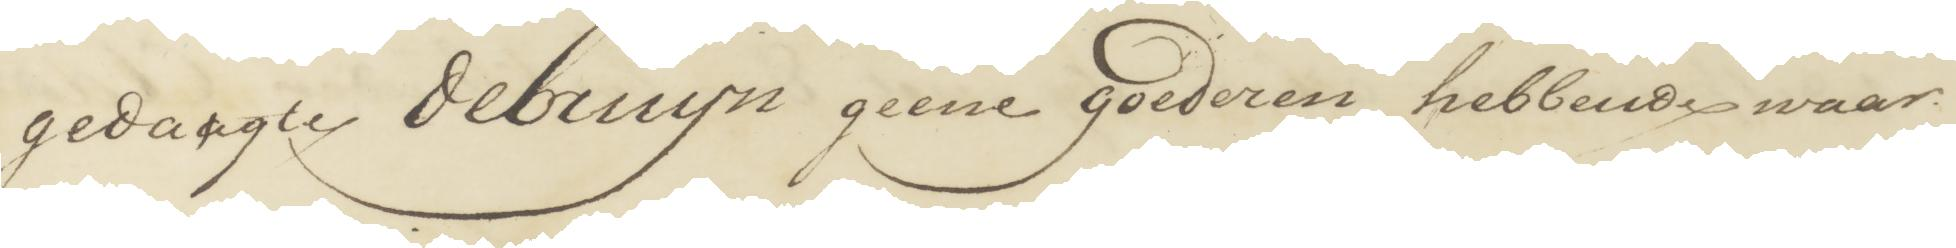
gedagte debruyn geene goederen hebbende waar
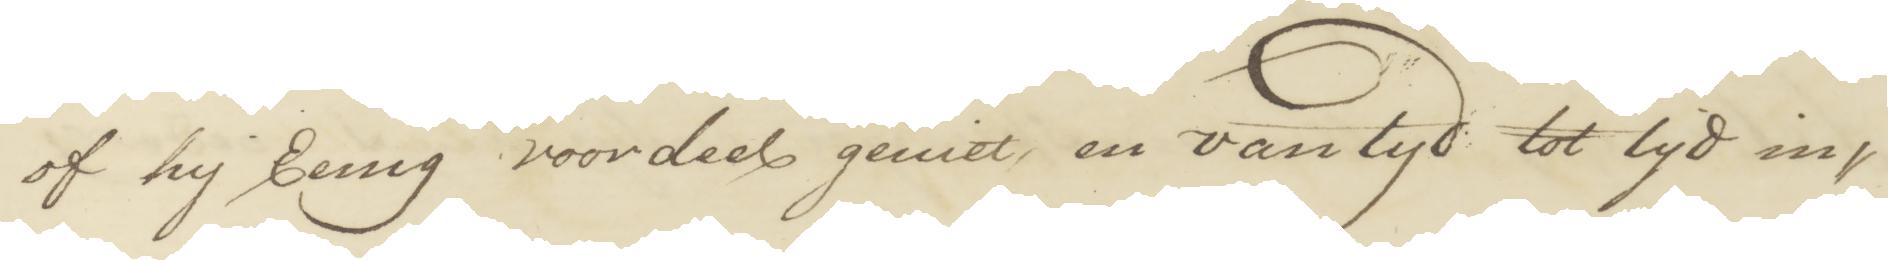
of hy Eenig voordeel geniet, en van tyd tot tyd in„
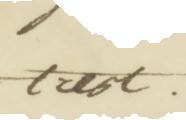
trest.
